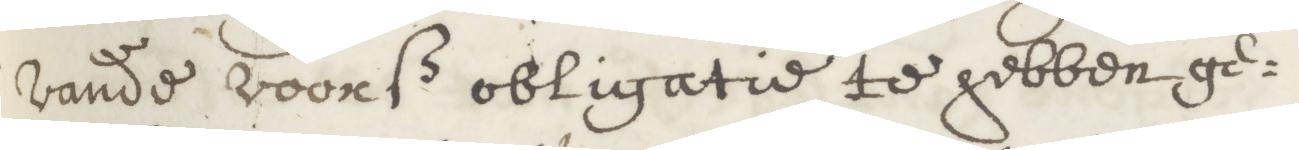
vande voors obligatie te hebben ge=
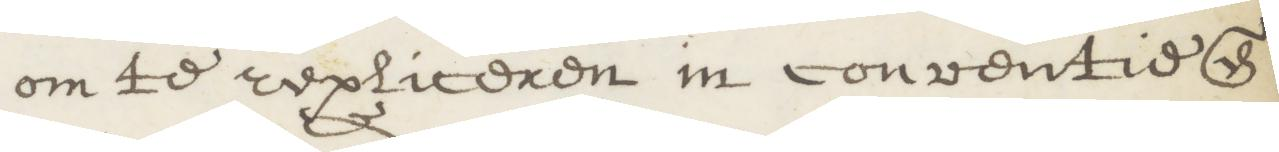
om te repliceren in conventie ende
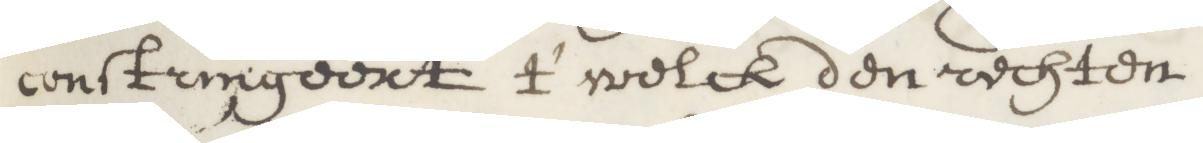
constringeert t' welck den rechten
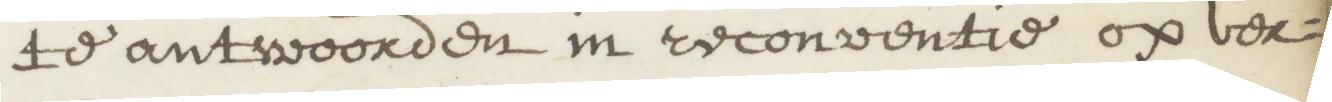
te antwoorden in reconventie op ver=
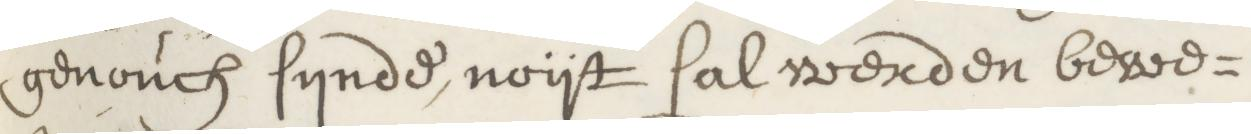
genouch synde, noijt sal werden bewe=
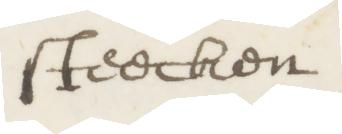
steecken
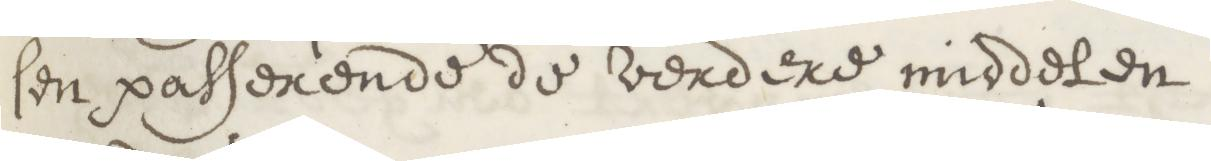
sen passerende de verdere middelen
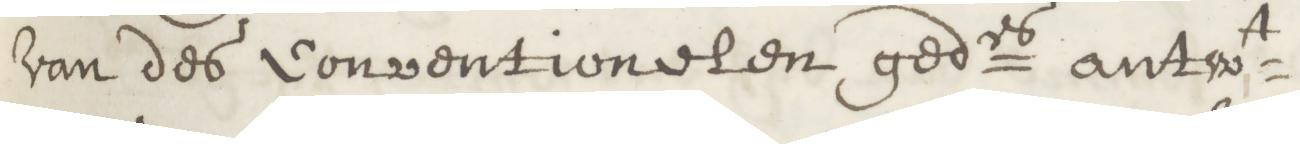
van des Conventionelen ged=es antw=t
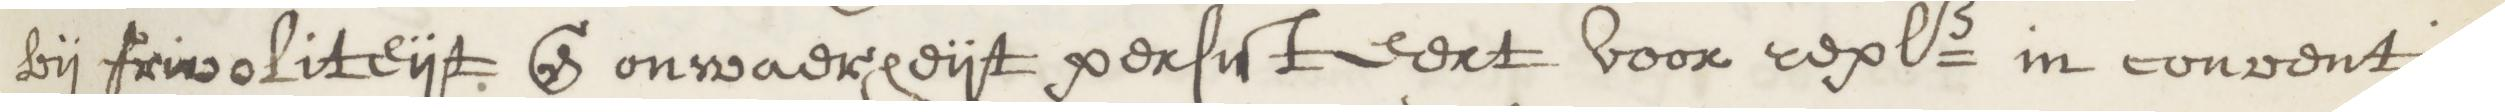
bij frivoliteijt ende onwaerheijt persisteert voor repl= in conventie
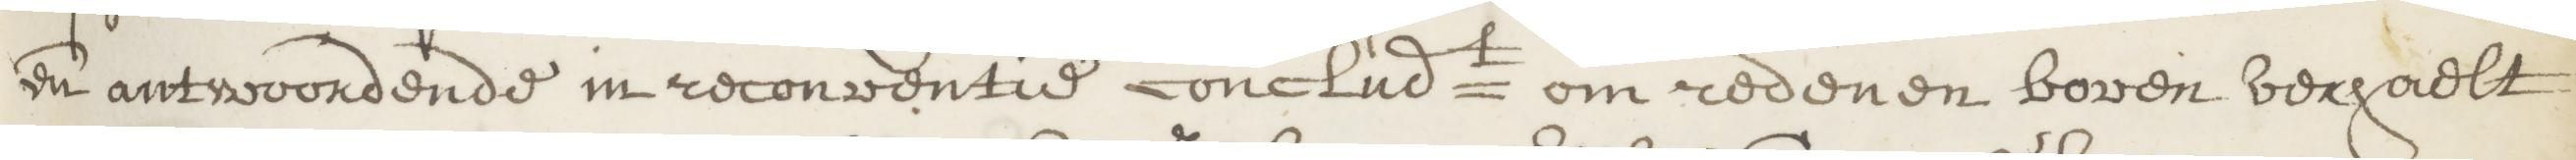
en antwoordende in reconventie conclud=t om redenen boven verhaelt
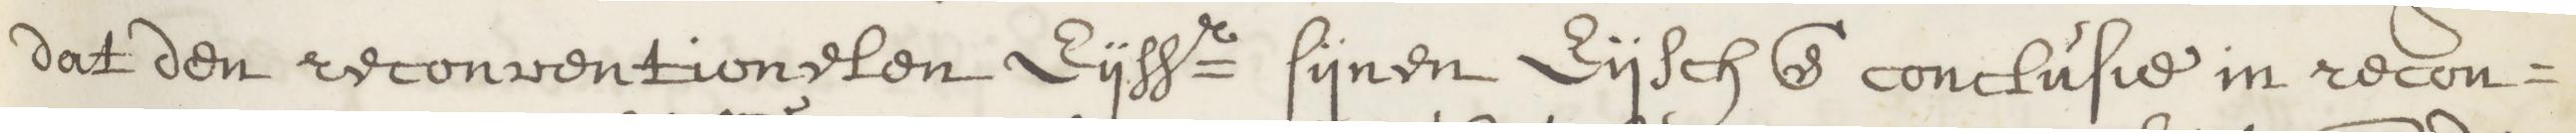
dat den reconventionelen Eijss=r sijnen Eijsch ende conclusie in recon=
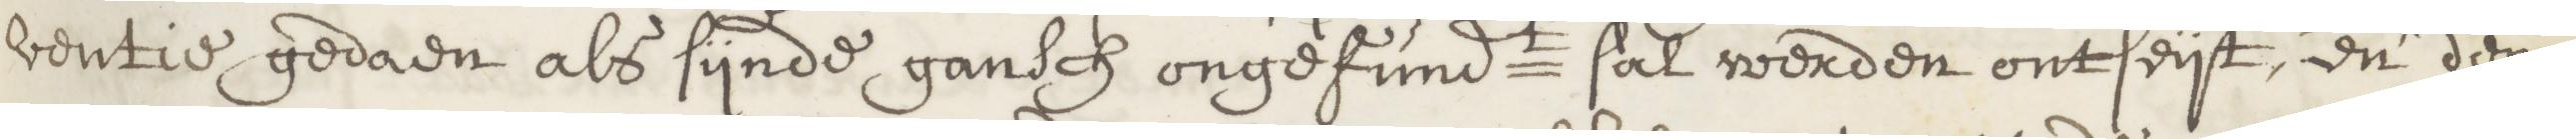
ventie gedaen als sijnde gansch ongefund=t sal werden ontseijt, en den
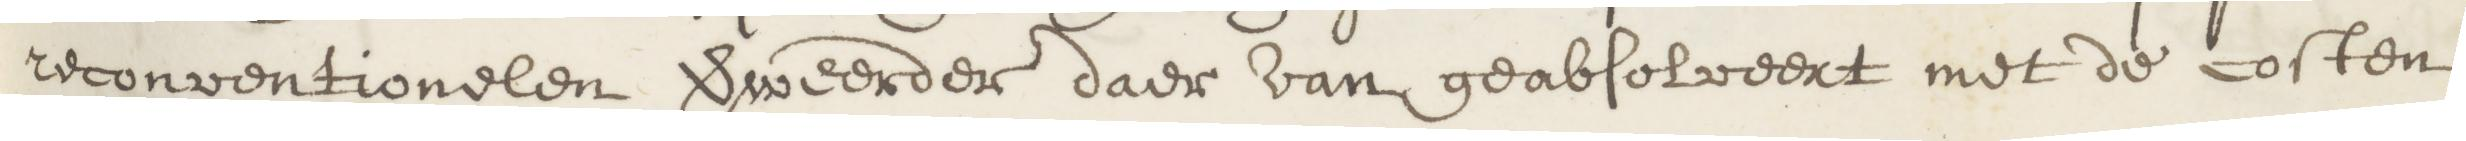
reconventionelen verweerder daer van geabsolveert met de costen
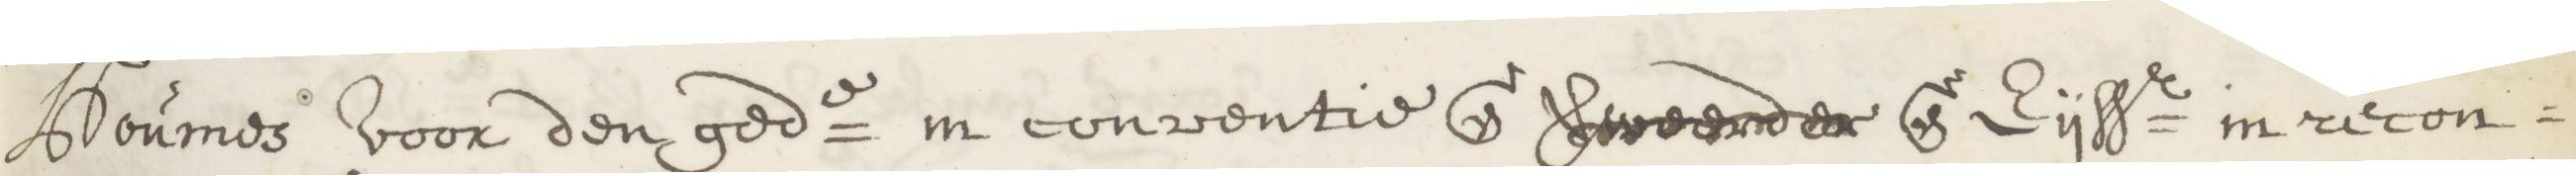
Houmes voor den ged=e in conventie ende verweerder ende Eijss=r in recon=
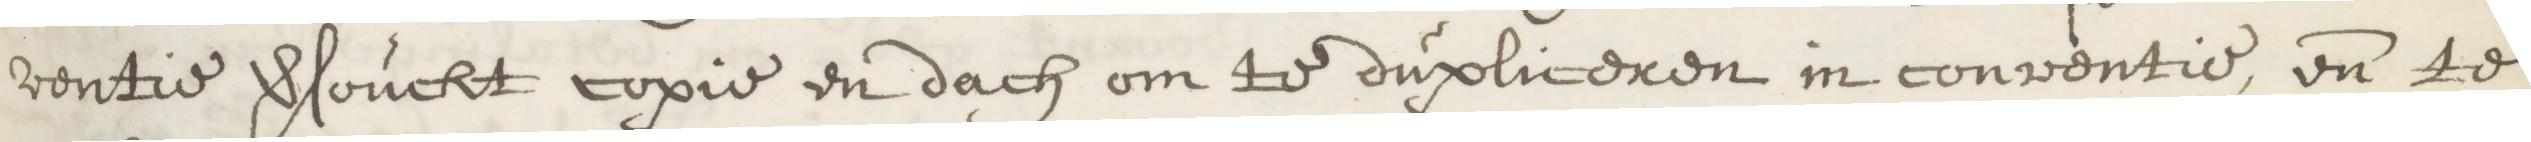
ventie versouckt copie en dach om te dupliceren in conventie, en te
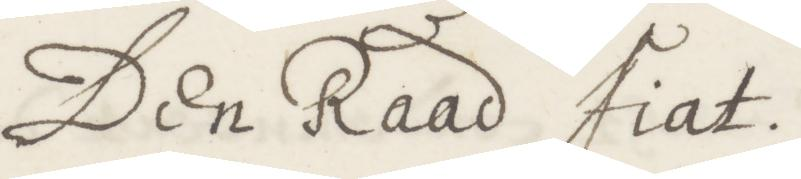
Den Raad Fiat.
